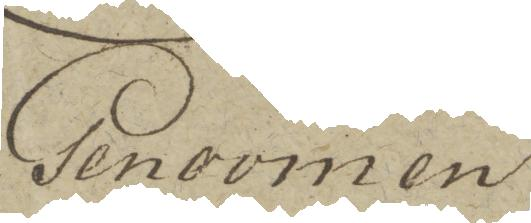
Genoomen
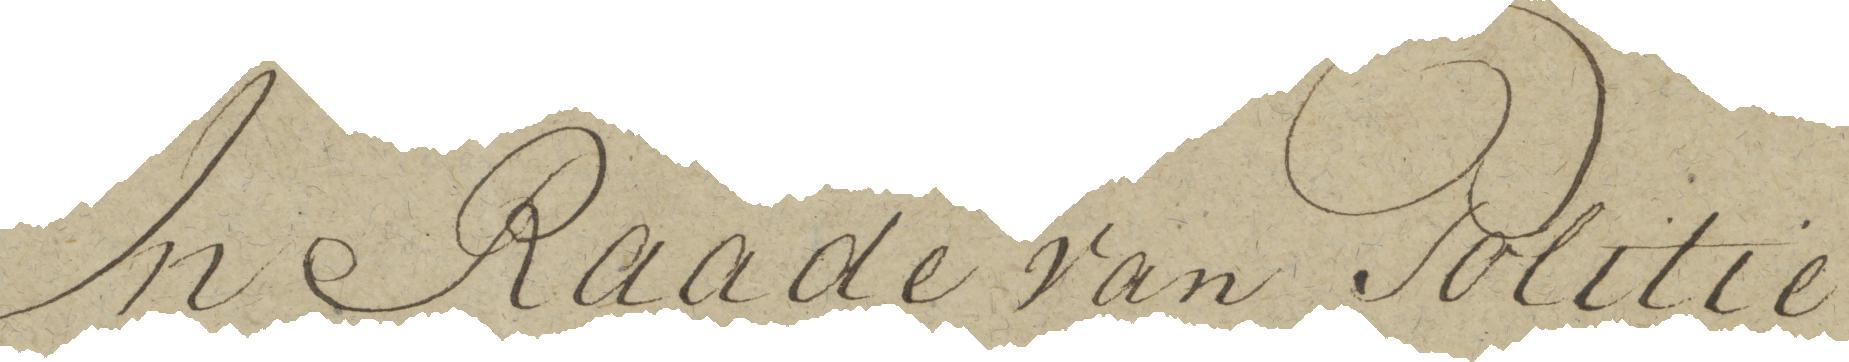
In Raade van Politie
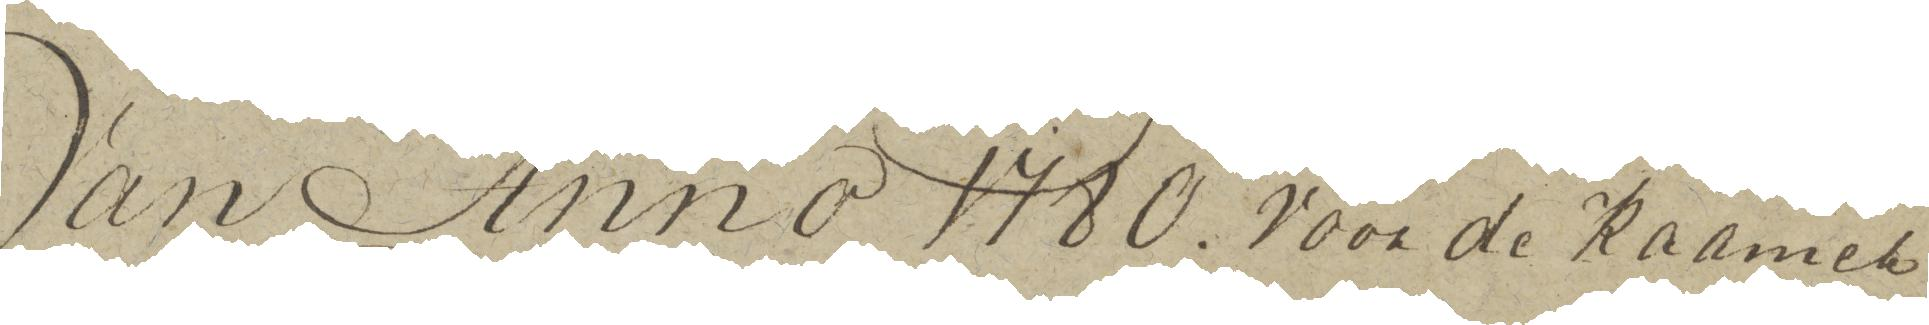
Van Anno 1780. voor de Kaamer
